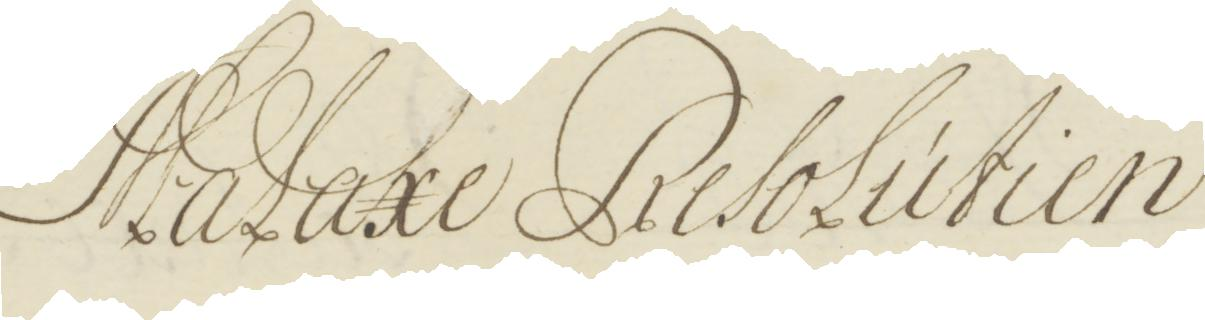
Malaxe Resolutien
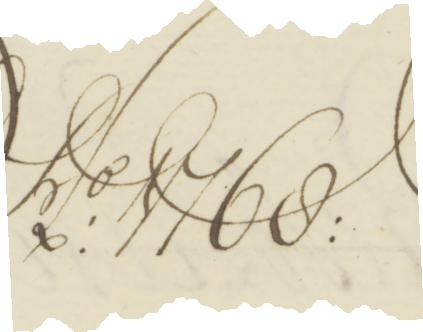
A„o 1768
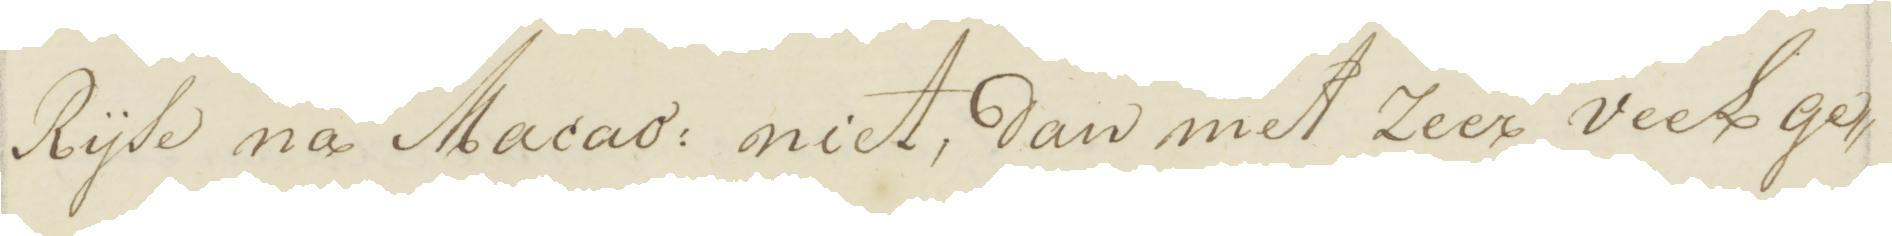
Rijse na Macao: niet, dan met zeer veel ge„
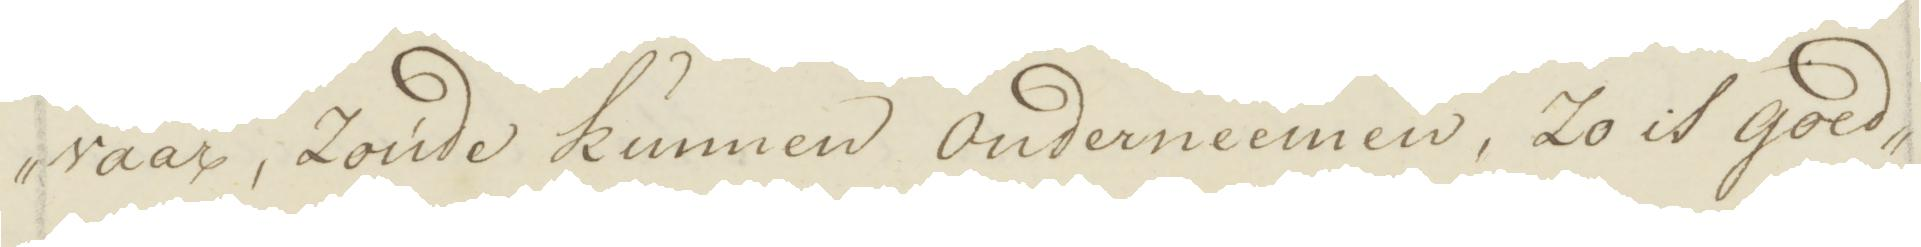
„vaar, zoude kunnen onderneemen, zo is goed„
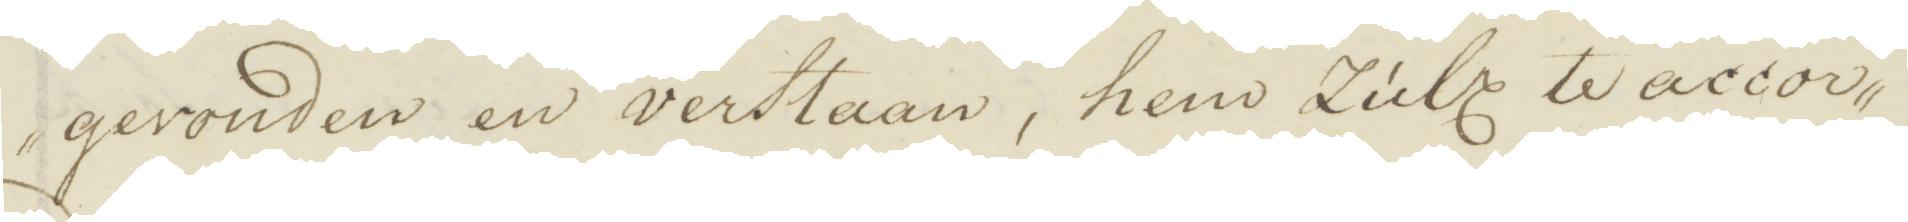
„gevonden en verstaan, hem zulx te accor„
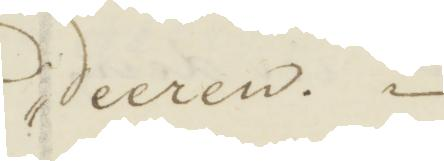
„deeren. —
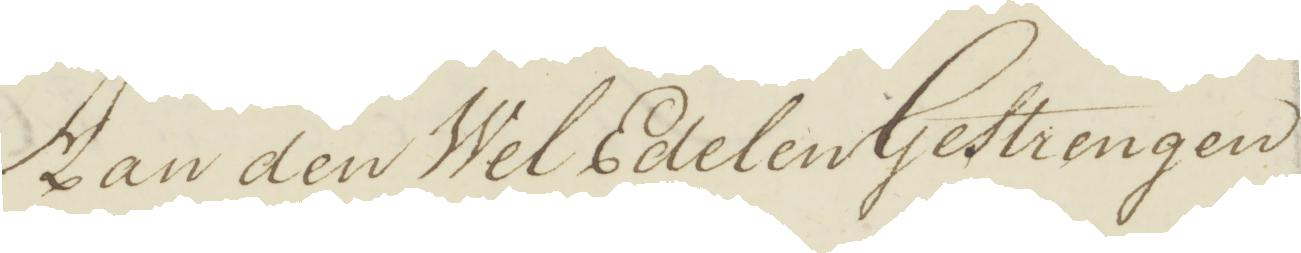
Aan den Wel Edelen Gestrengen
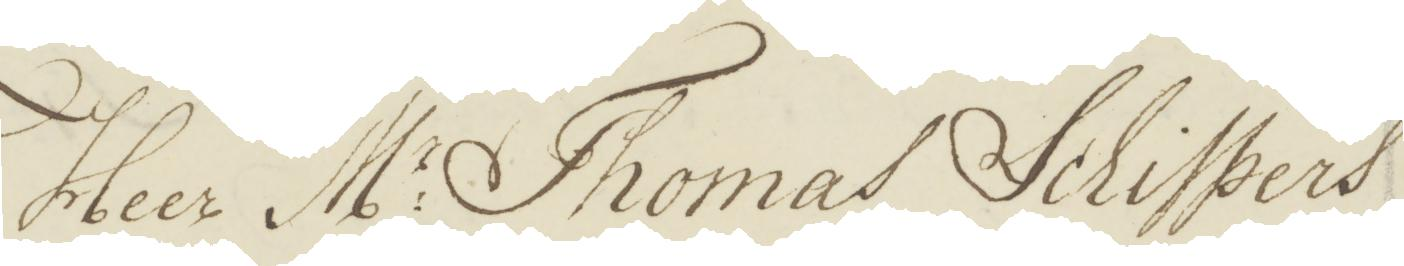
Heer M:r Thomas schippers
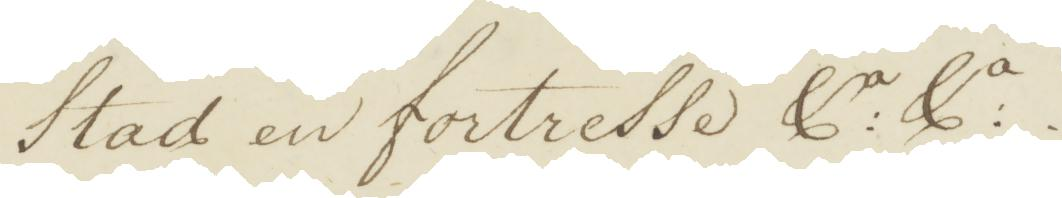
stad en fortresse &:a: &:a
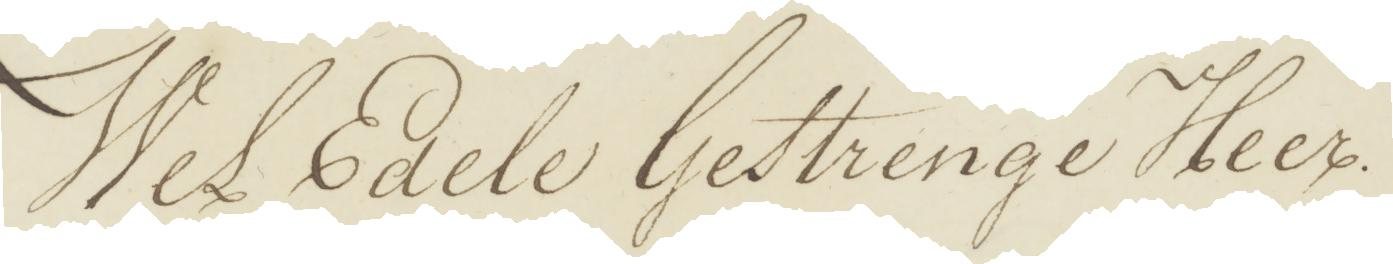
Wel Edele Gestrenge Heer!
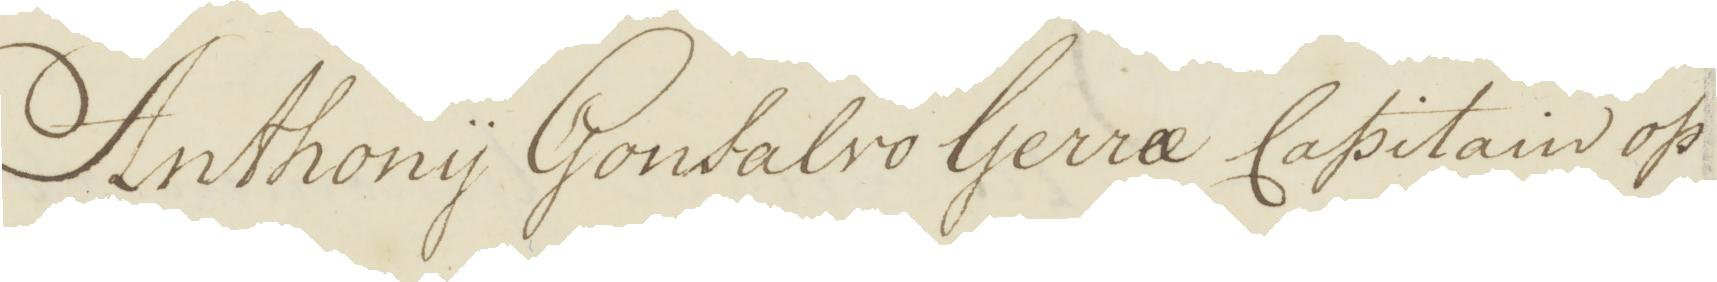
Anthonij Gonsalvo Gerra Capitain op
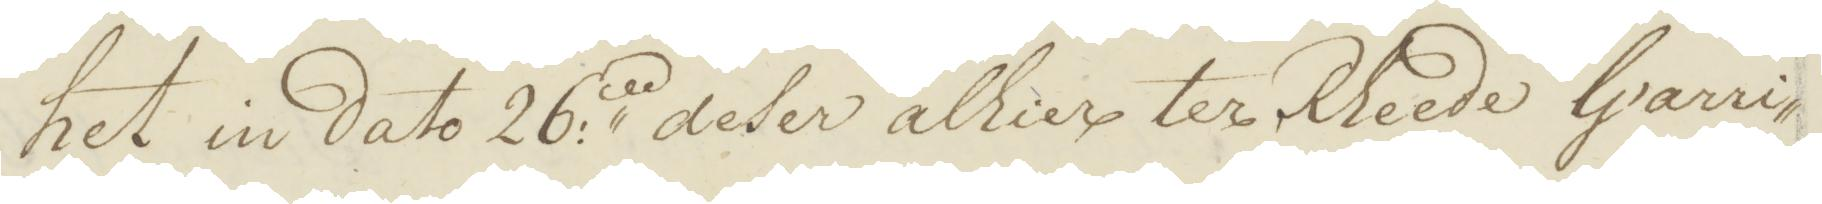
het in dato 26:e deser alhier ter Rheede G'arri„
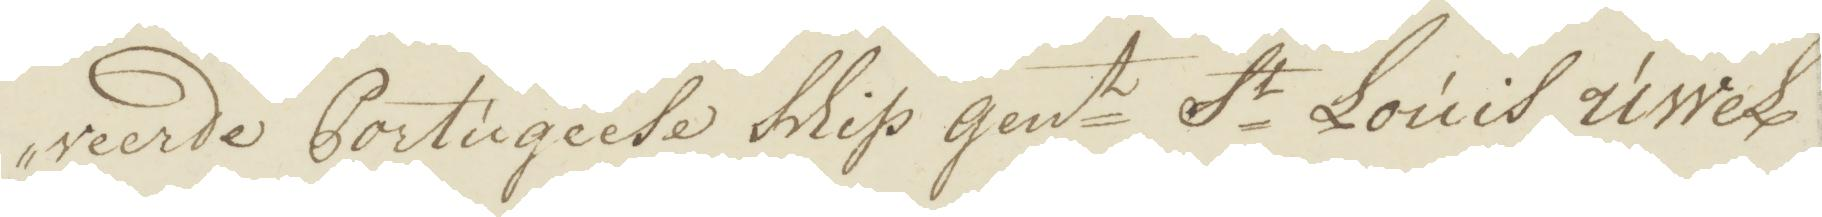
„veerde Portugeese schip gen=t S=t Louis uwel
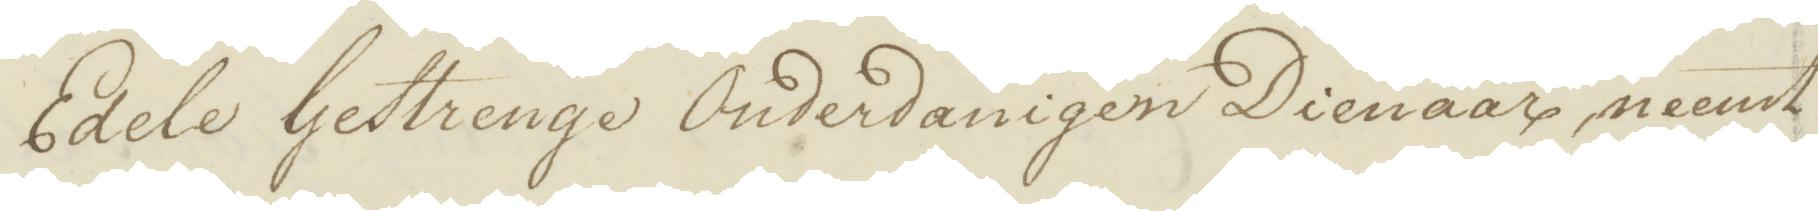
Edele Gestrenge Onderdanigen Dienaar neemt
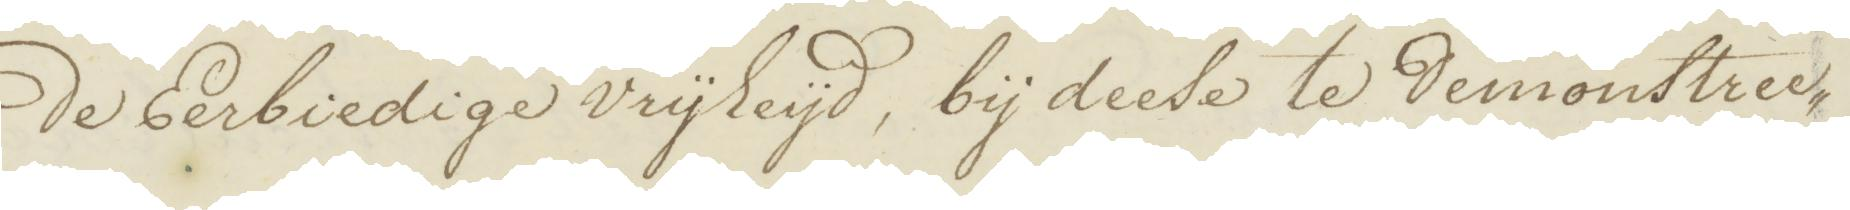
de Eerbiedige vrijheijd, bij deese te demonstree„
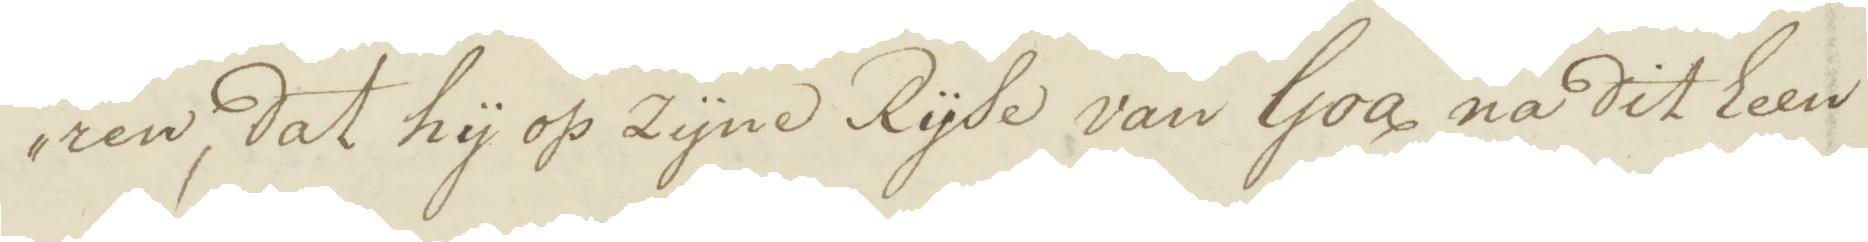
„ren, dat hij op zijne Rijse van Goa na dit heem
